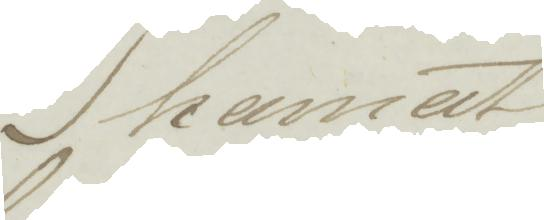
Thamat
